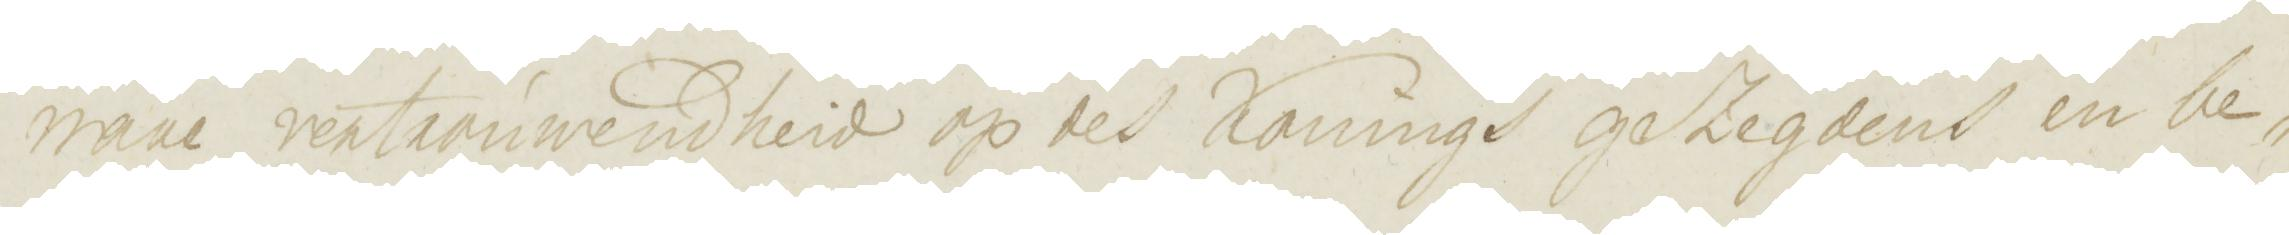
ware vertrouwendheid op des konings gezegdens en be
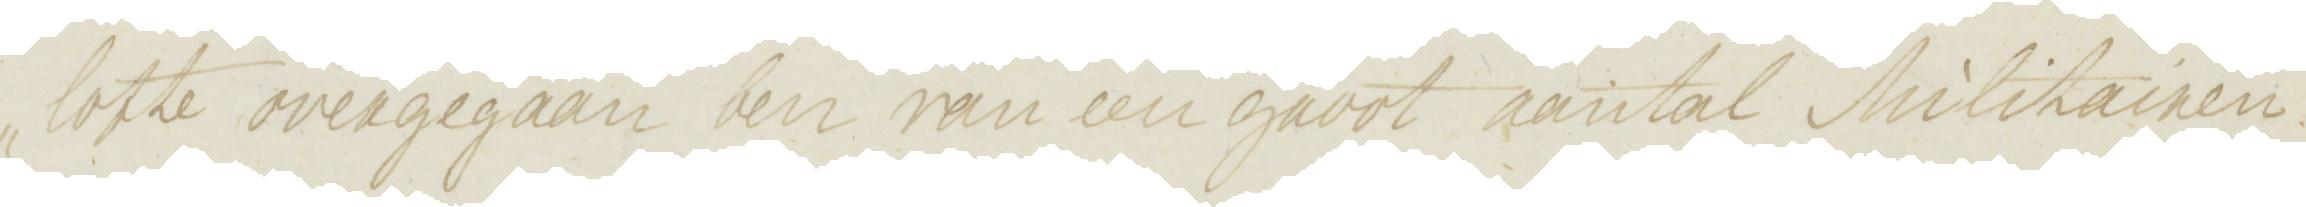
lofte overgegaan ben van een groot aantal Militairen
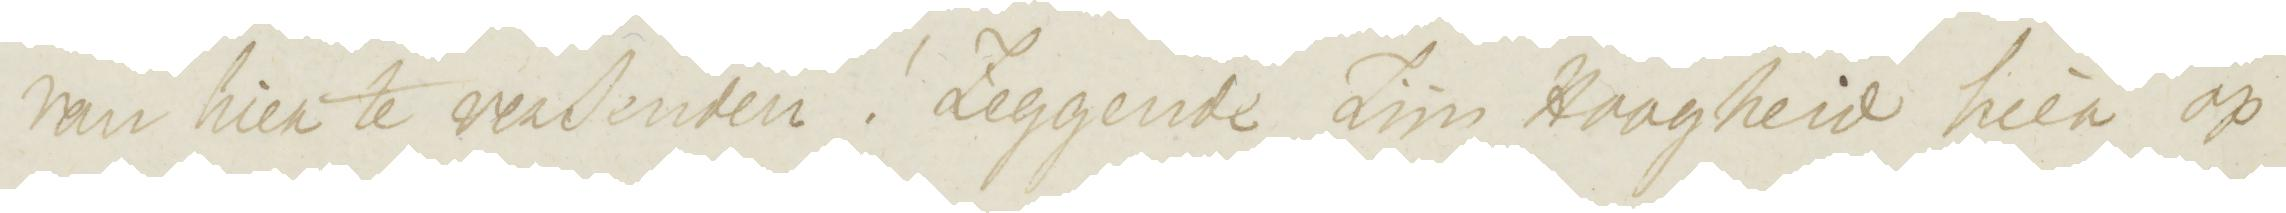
van hier te versenden! Zeggende zijn Hoogheid hier op
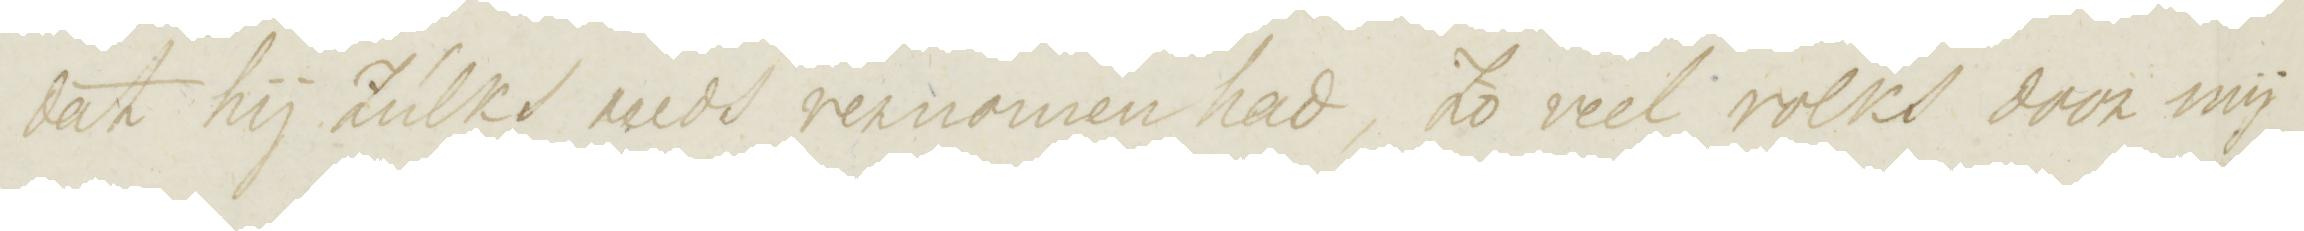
dat hij zulks reeds vernomen had, zo veel volks door mij
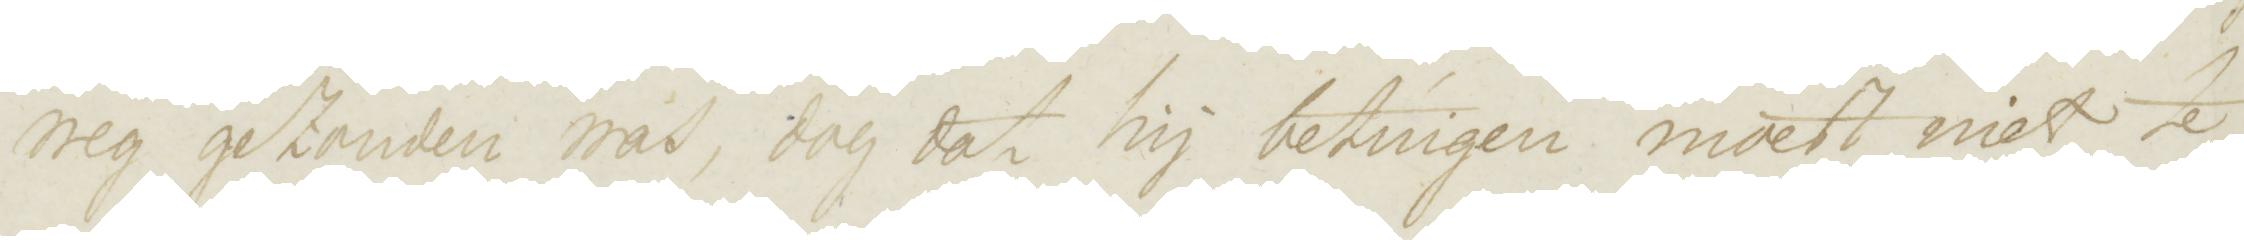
weg gezonden was, dog dat hij betuigen moest niet te
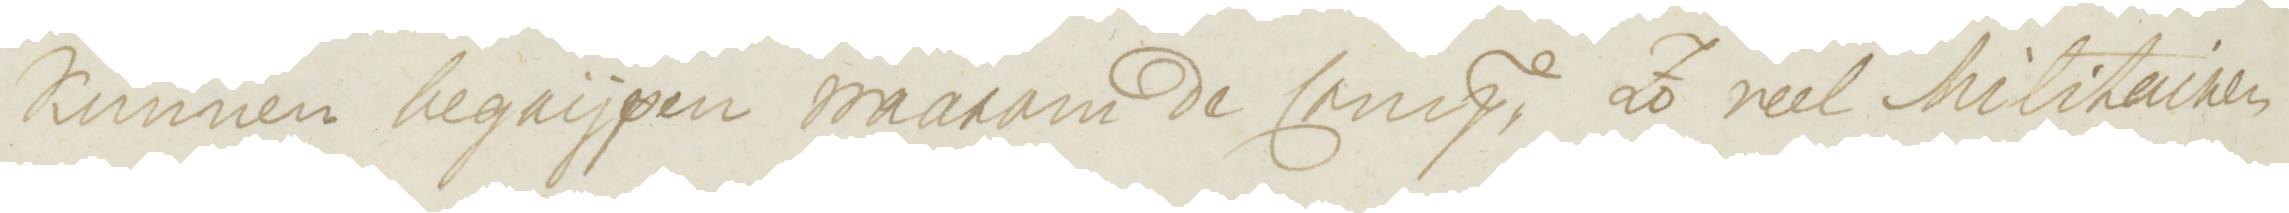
kunnen begrijpen waarom de Comp„e zo veel Militairen
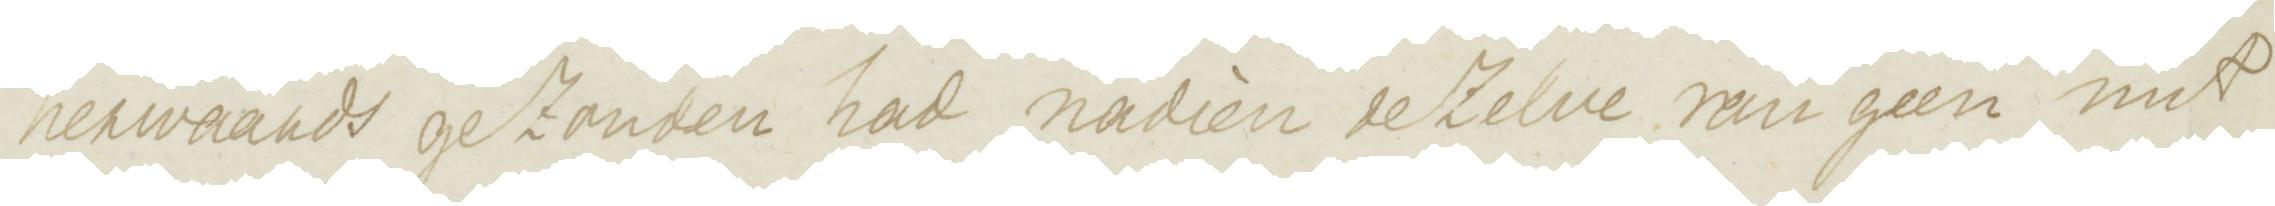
herwaards gezonden had nadien dezelve van geen nut
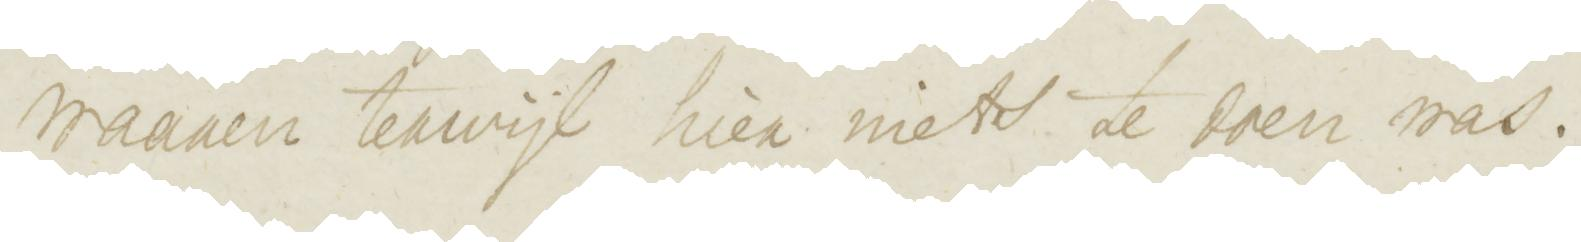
waaren terwijl hier niets te doen was.
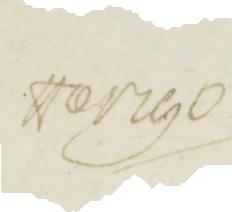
Ao 1790
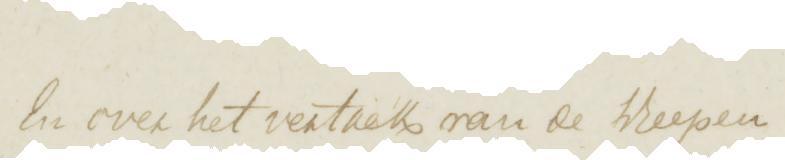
En over het vertrek van de scheepen
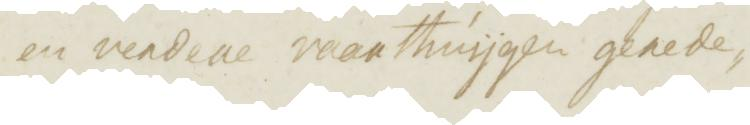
en verdere vaarthuijgen gerede
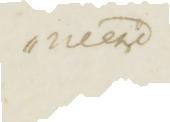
„neerd
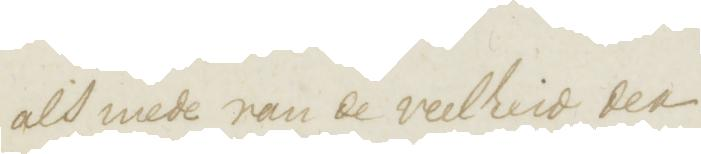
als mede van de veelheid der
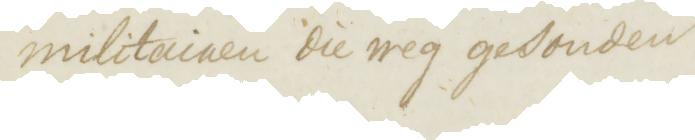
militairen die weg gesonden
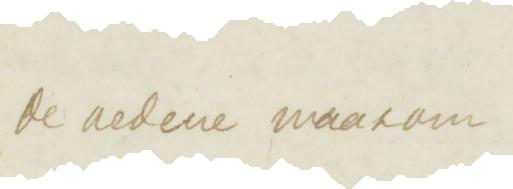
de redene waarom
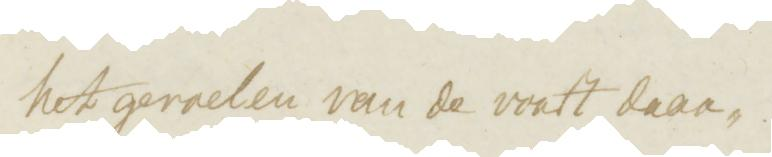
het gevoelen van de vorst daar„
